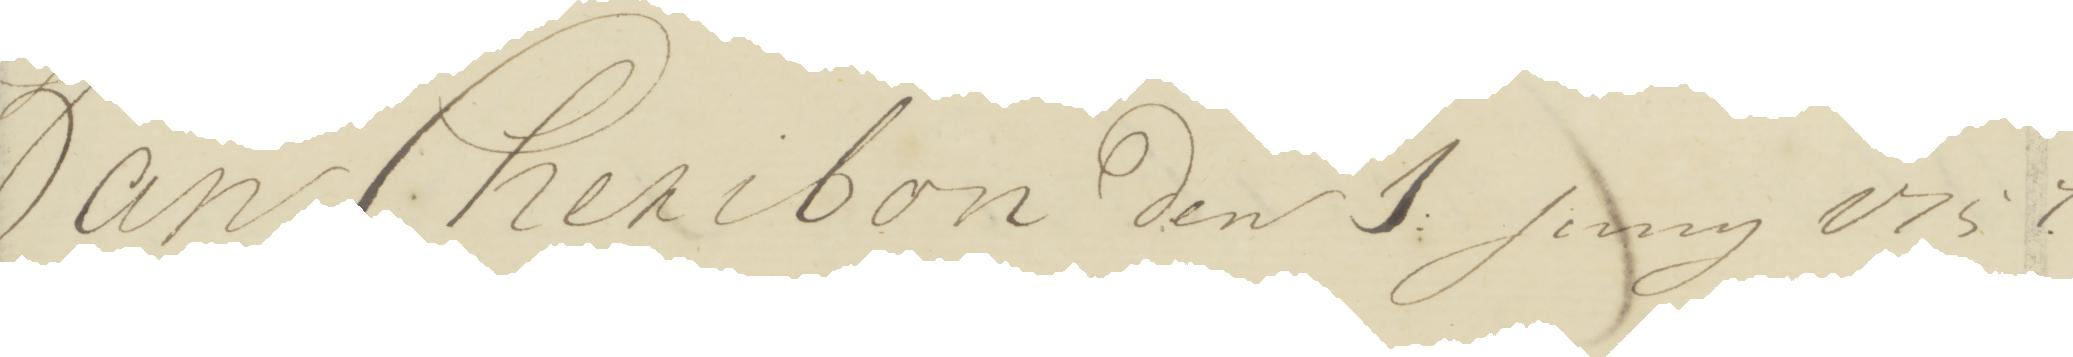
Van Cheribon den 1: Juny 1757.
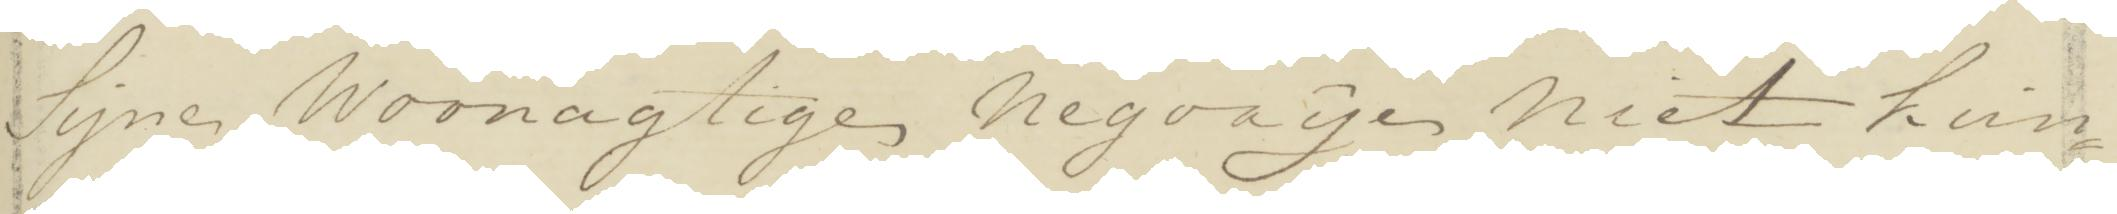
sijne woonagtige negorije niet kun„
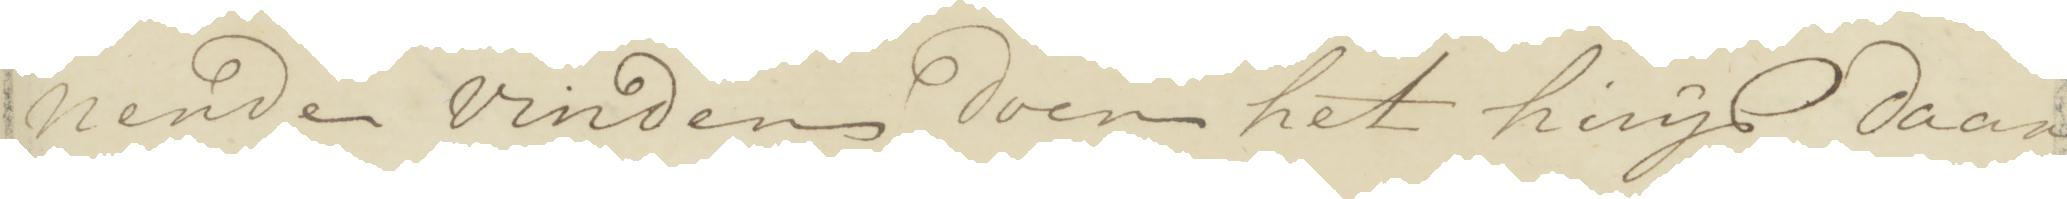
nende vinden, doen het huijs daar
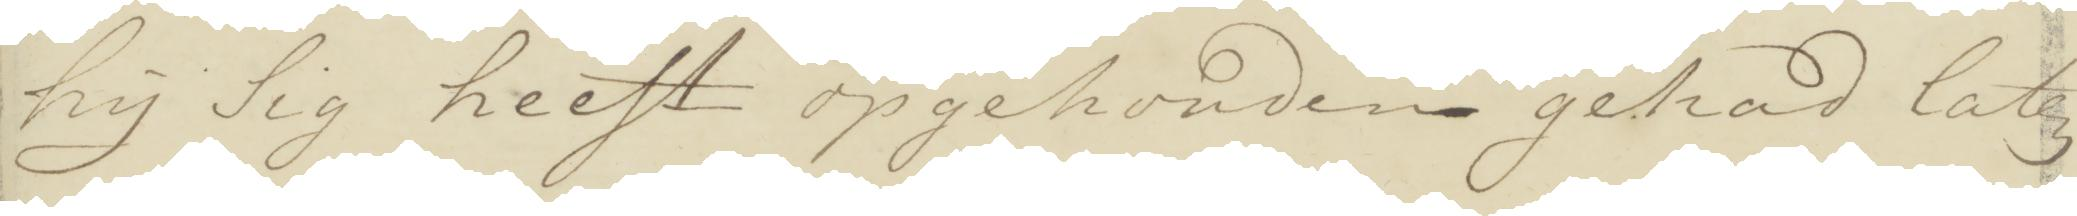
hij sig heeft opgehouden gehad laten
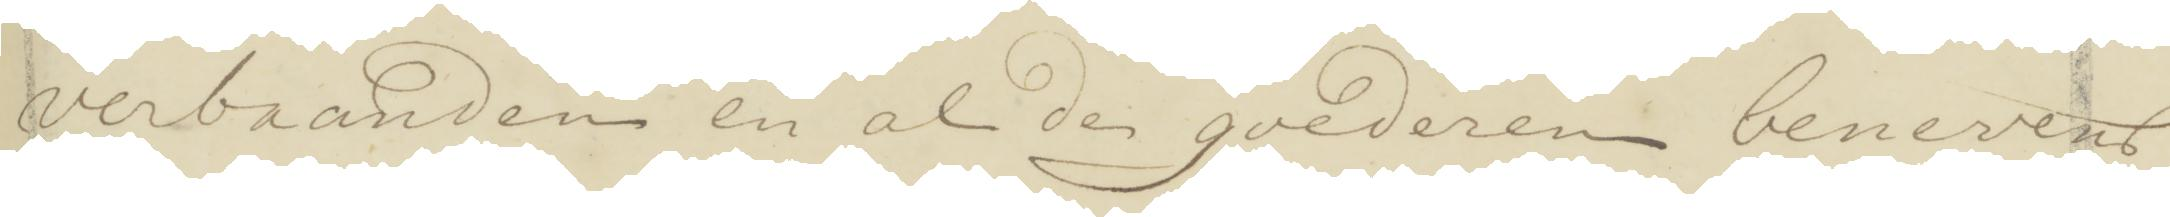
verbranden en al de goederen benevens
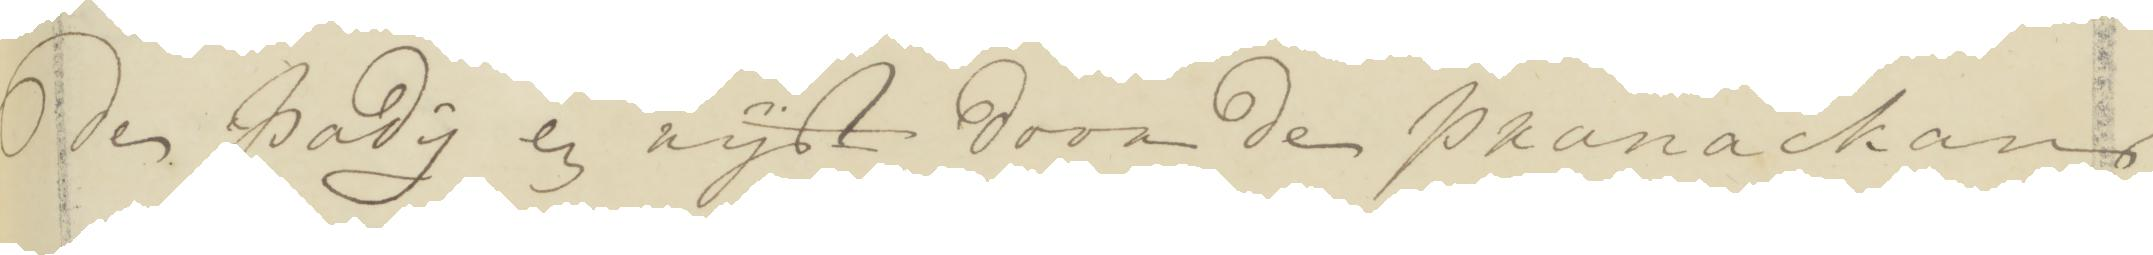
de padij en rijst door de pranackans
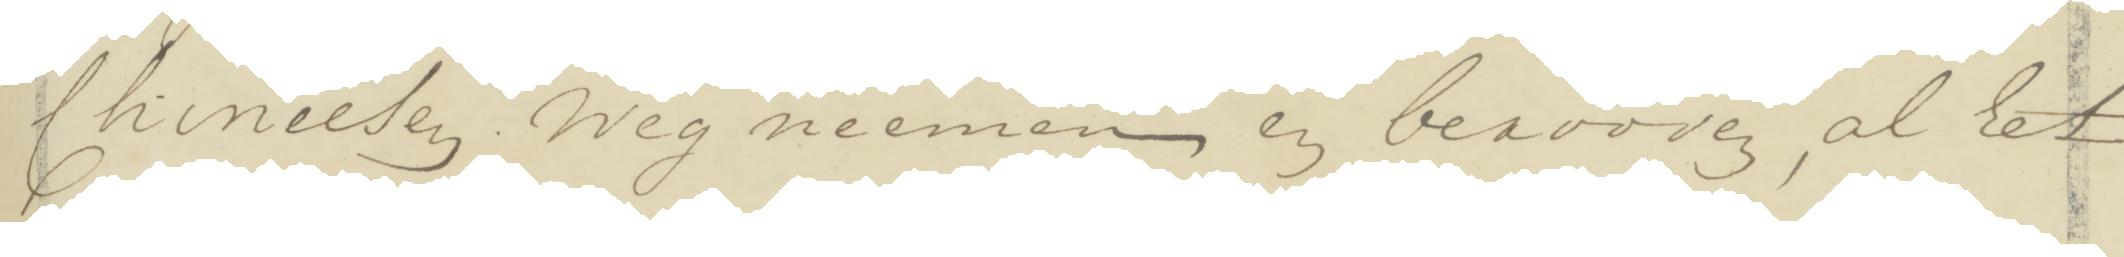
Chineesen weg neemen en berooven, al het
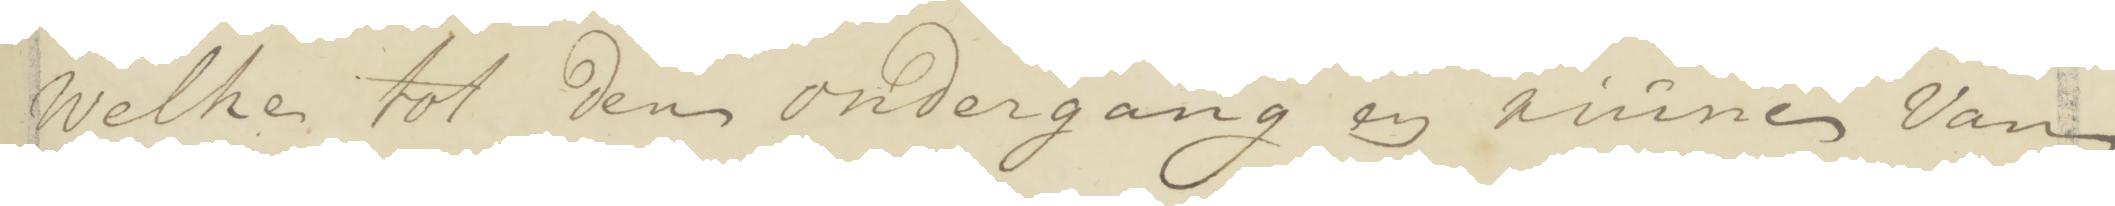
welke tot den ondergang en ruine van
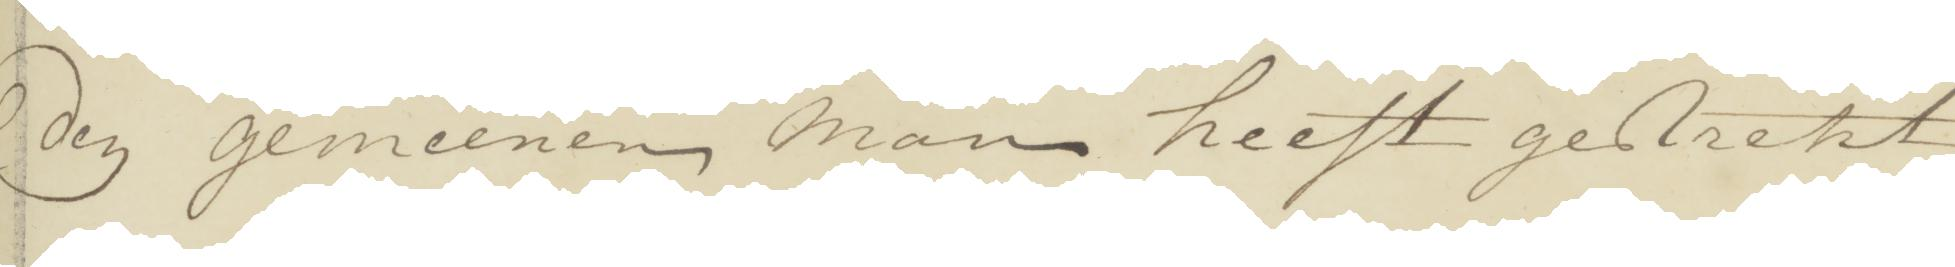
den gemeenen man heeft gestrekt.
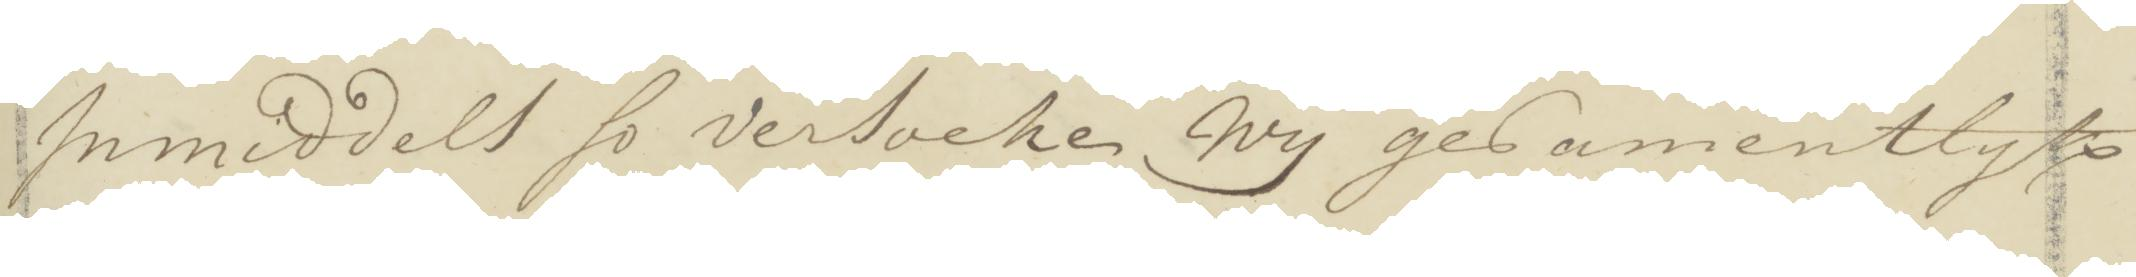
Jnmiddels so versoeke wy gesamentlyk
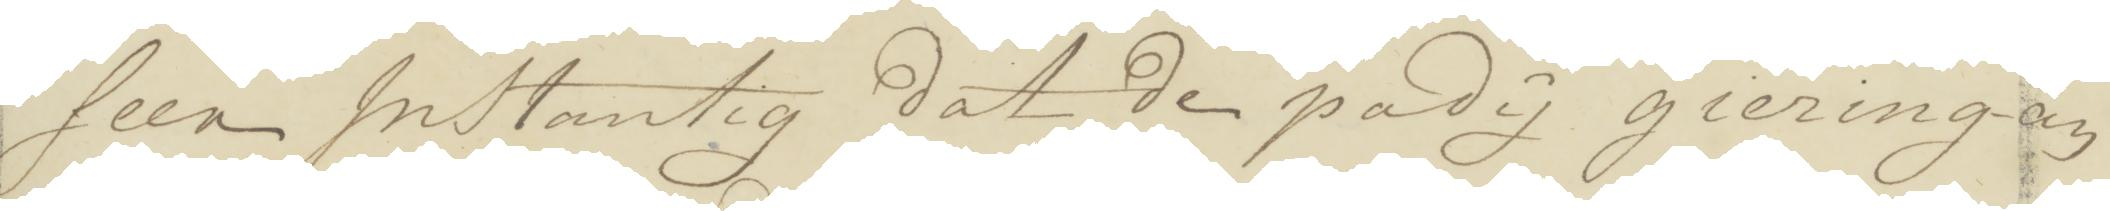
seer Jnstantig dat de padij giering-an
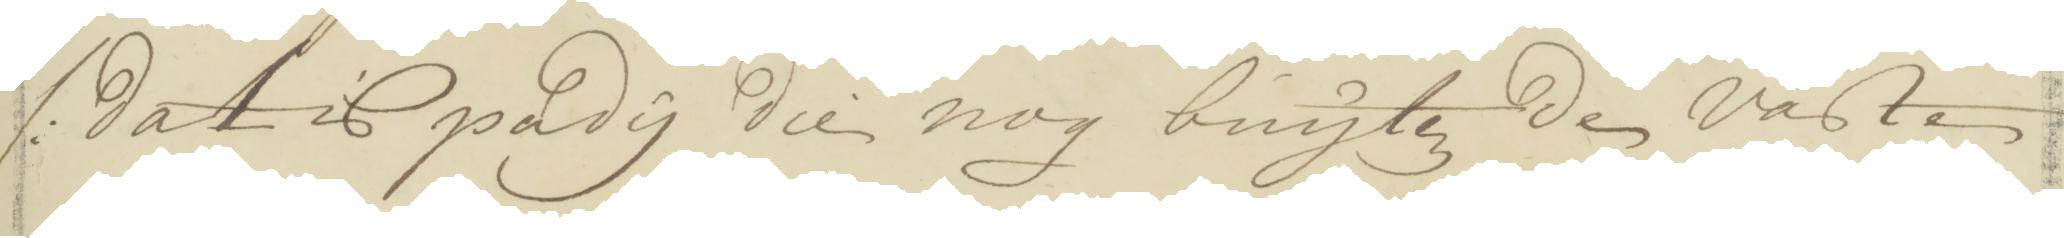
/:dat is padij die nog buijten de vaste
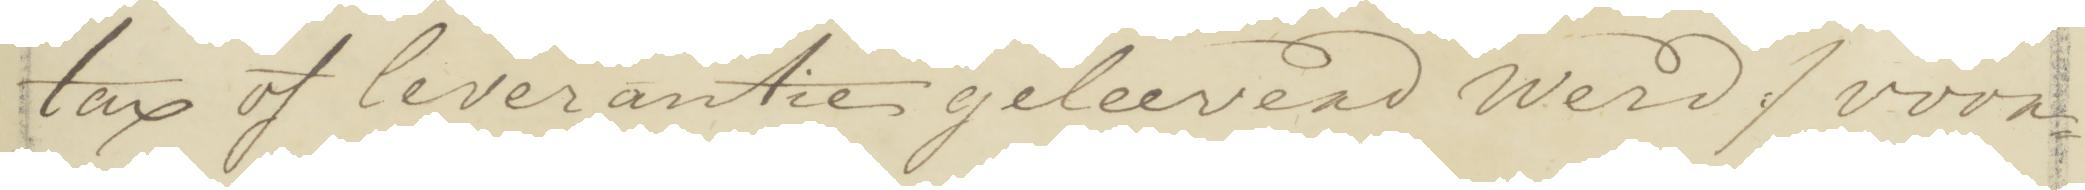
tax of leverantie geleeverd werd:/ voor=
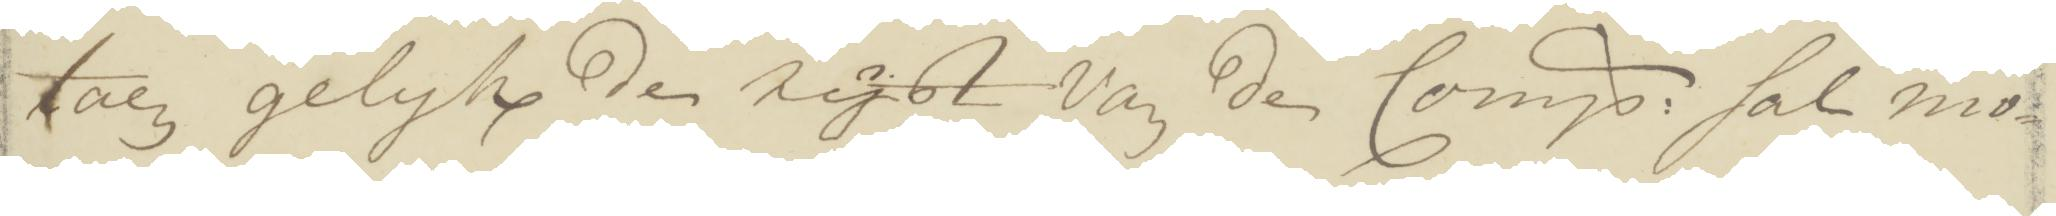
taen gelijk de rijst van de Comp: sal mo=
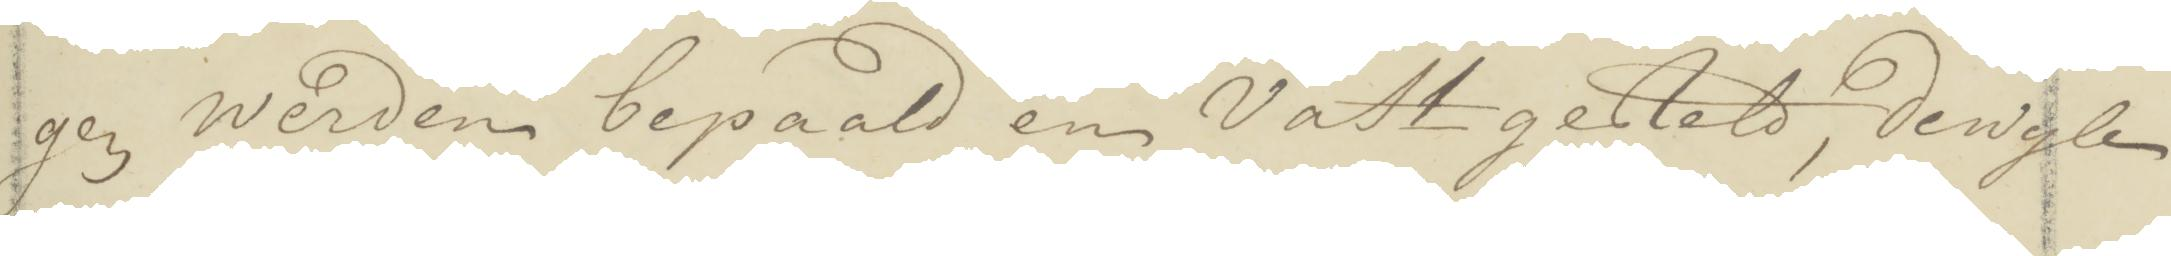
gen werden bepaald en vastgesteld, dewyle
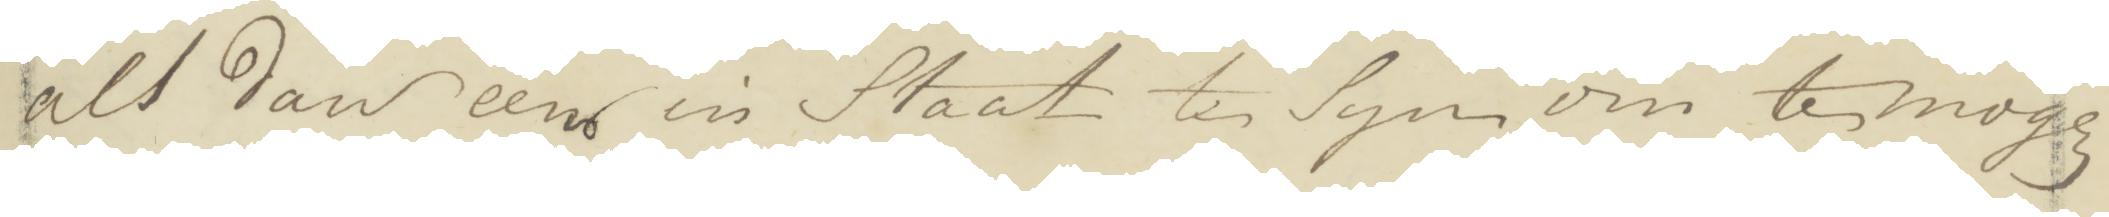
als dan eens in staat te syn om te mogen
